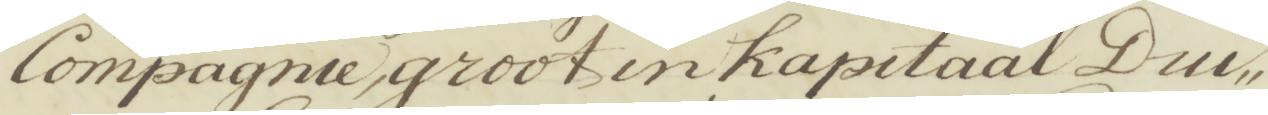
Compagnie, groot in Kapitaal Dui„
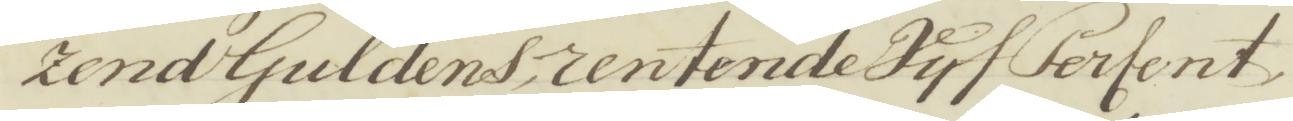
zend Guldens, rentende Vyf Percent
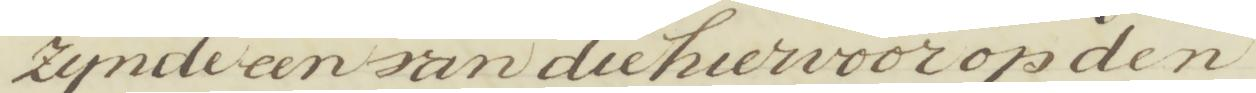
zynde een van die hiervoor op den
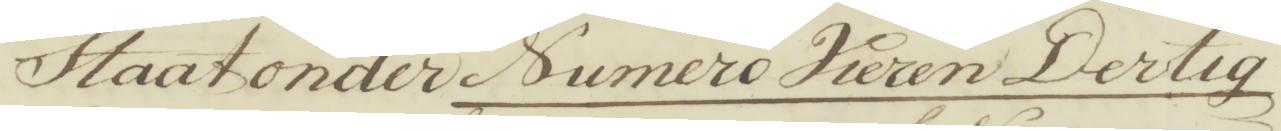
Staat onder Numero Vieren Dertig
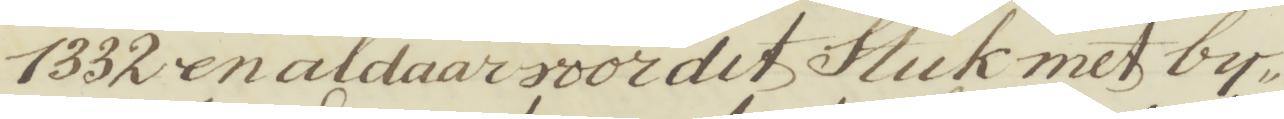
1332 en aldaar voor dit Stuk met by„
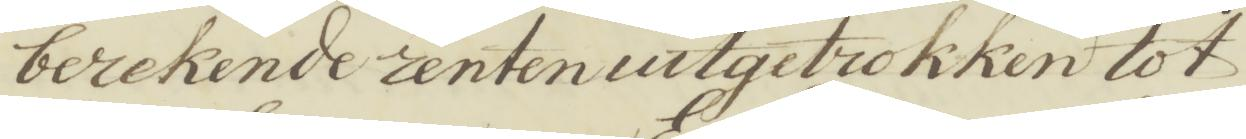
berekende renten uitgetrokken tot
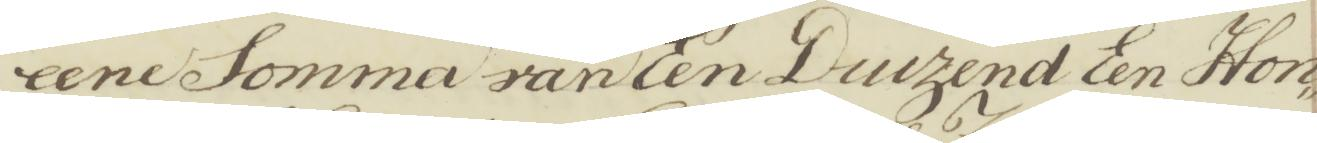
eene Somma van Een Duizend Een Hon
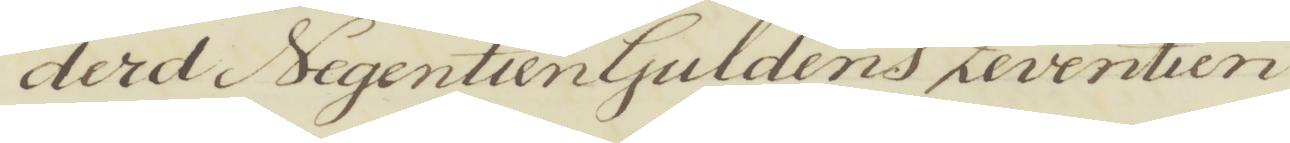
derd Negentien Guldens Zeventien
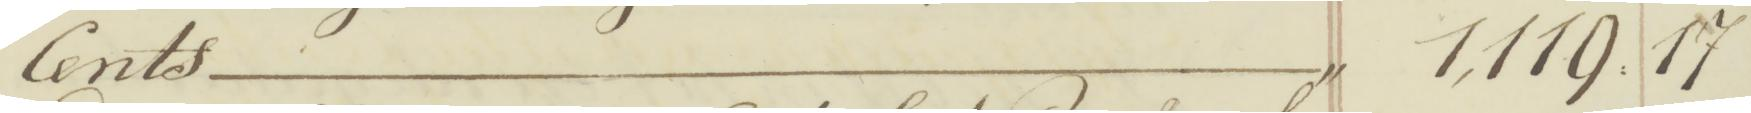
Cents — „ 1,119:17
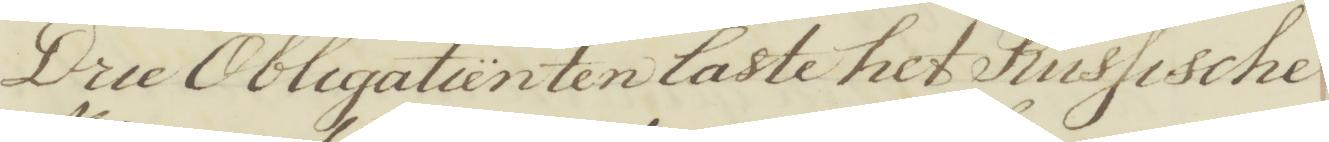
Drie Obligatien ten laste het Russische
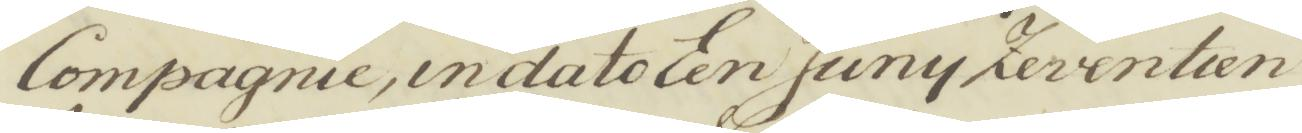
Compagnie, in dato Een Juny Zeventien
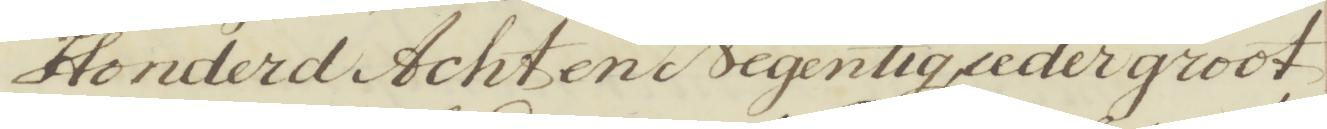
Honderd Acht en Negentig, ieder groot
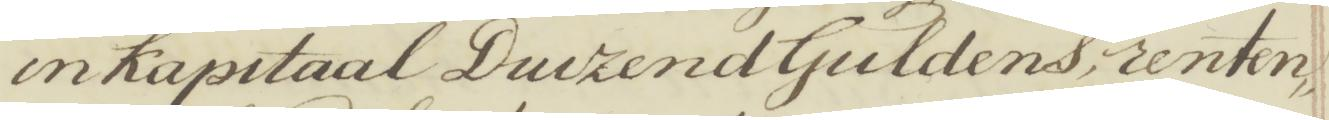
in kapitaal Duizend Guldens, renten„
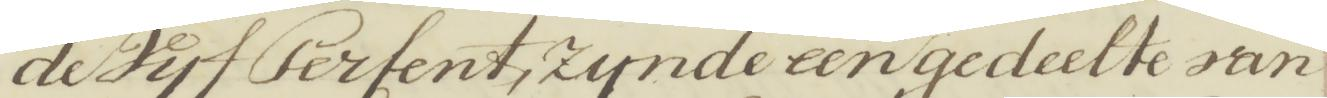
de Vyf Percent, zynde een gedeelte van
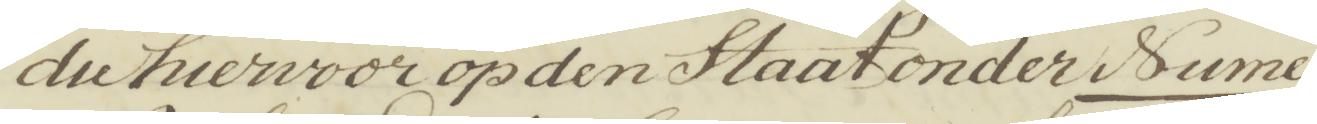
die hiervoor op den Staat onder Nume
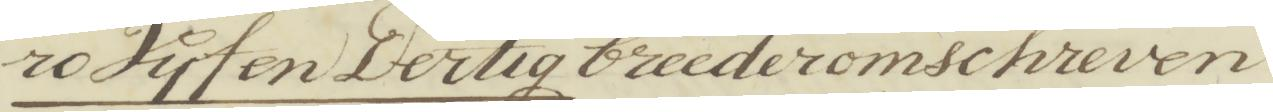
ro Vyf en Dertig breeder omschreven
